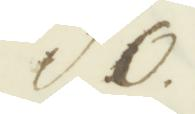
I.O.
